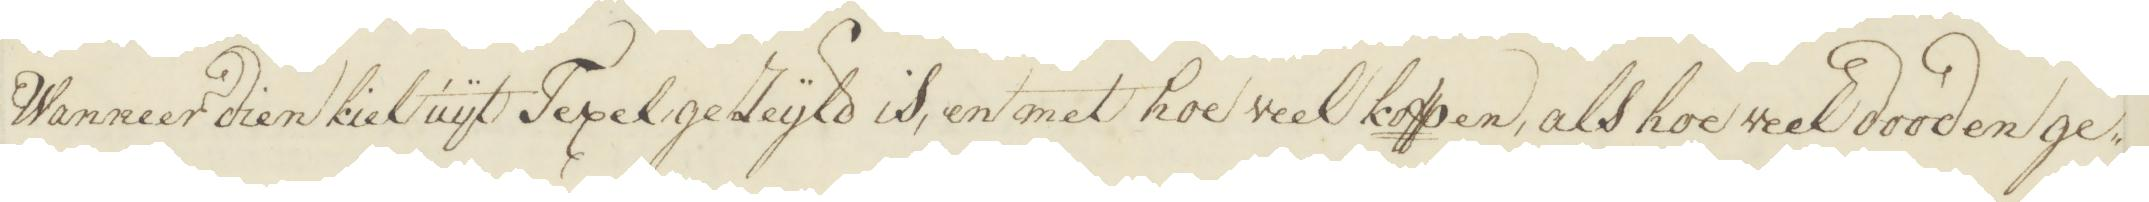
Wanneer dien kiel uijt Texel gezeijld is, en met hoeveel koppen, als hoe veel dooden ge„
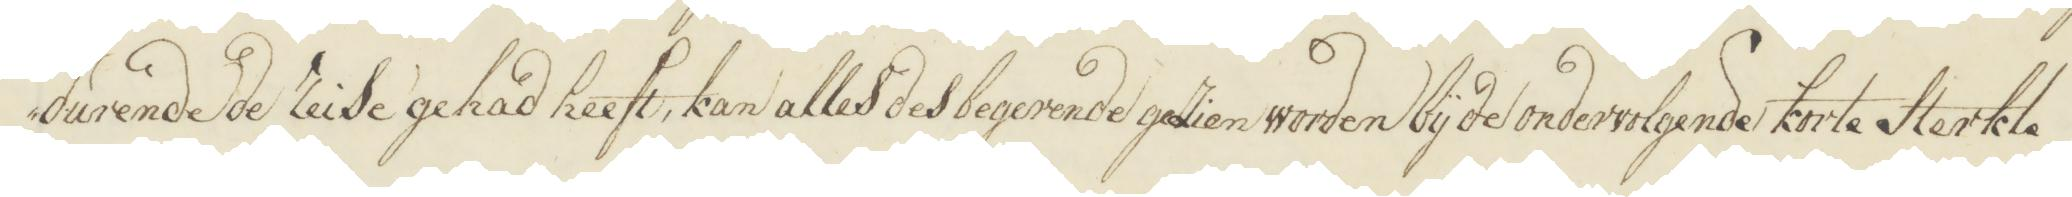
„durende de reise gehad heeft, kan alles des begerende gezien worden bij de ondervolgende korte Sterkte
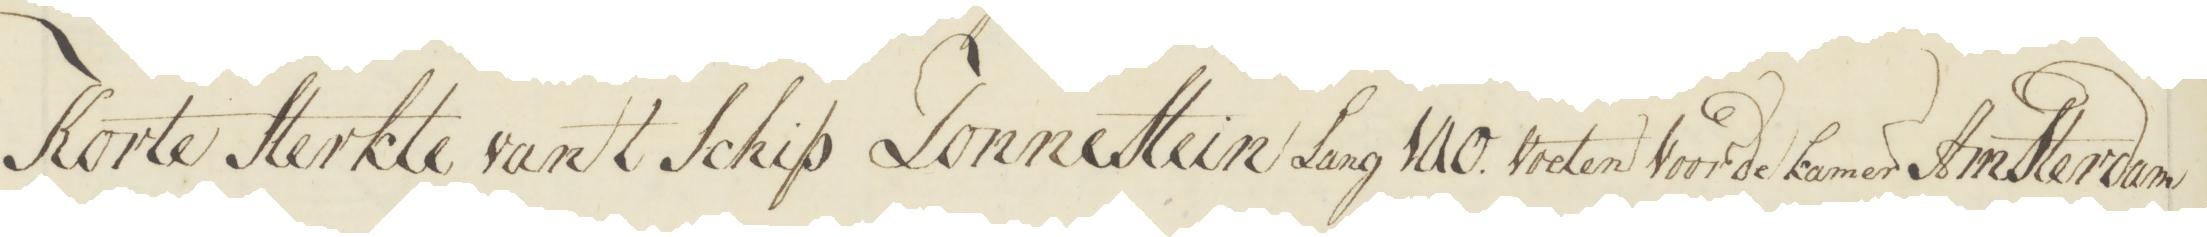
Korte Sterkte van ’t schip Zonnestein Lang 140. voeten voor de kamer Amsterdam
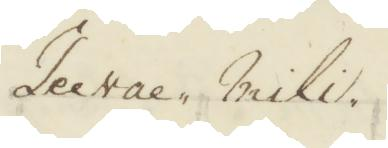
Zeevae„ mili„
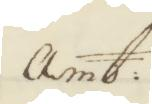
Amb:
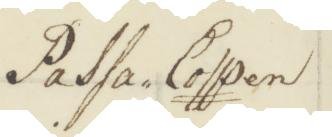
Passa„ Coppen
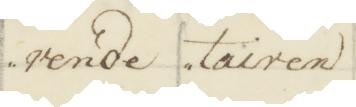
„rende „tairen
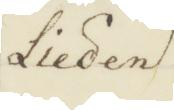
Lieden
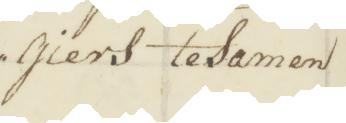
„giers tesamen
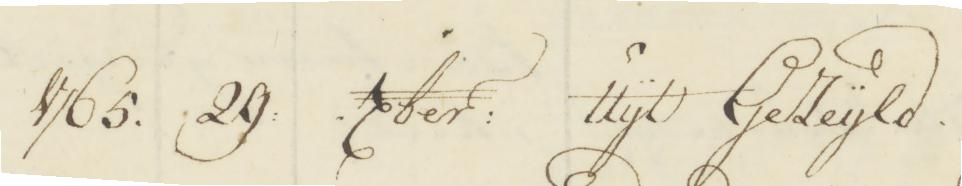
1765. 29: xber: Uijt gezeijld
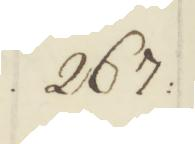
267:
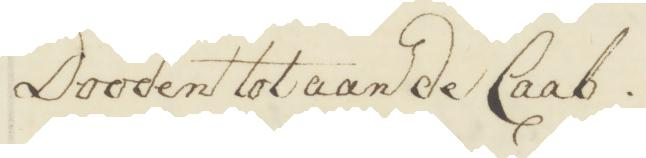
Dooden tot aan de Caab
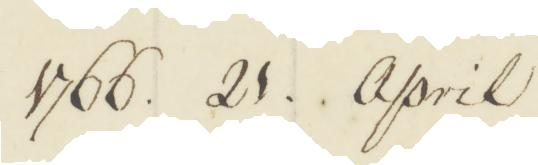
1766. 21. April
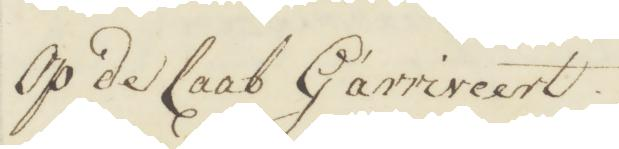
Op de Caab G'arriveert
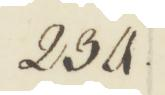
234.
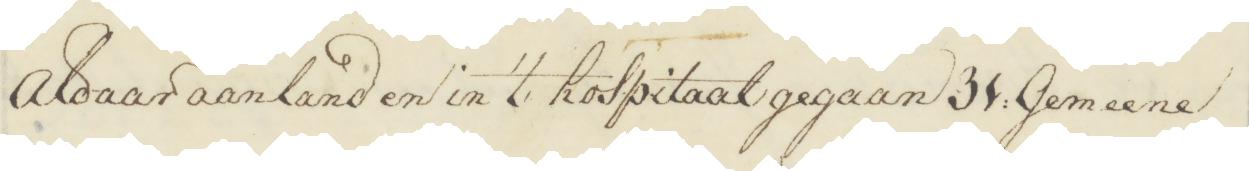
aldaar aan land en in ’t hospitaal gegaan 31: gemeene
